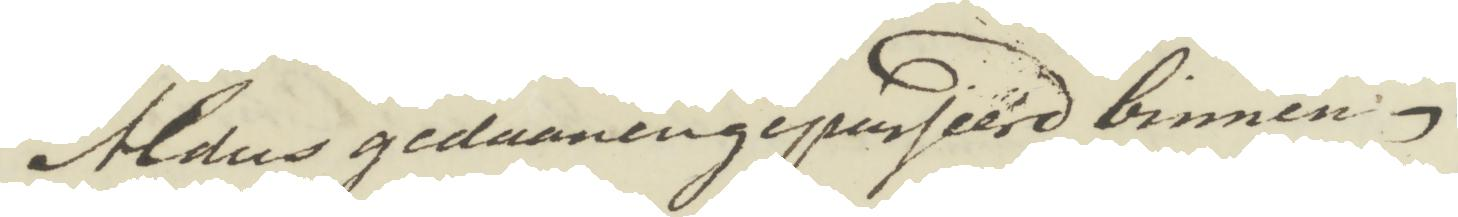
Aldus gedaan en gepasseerd binnen -
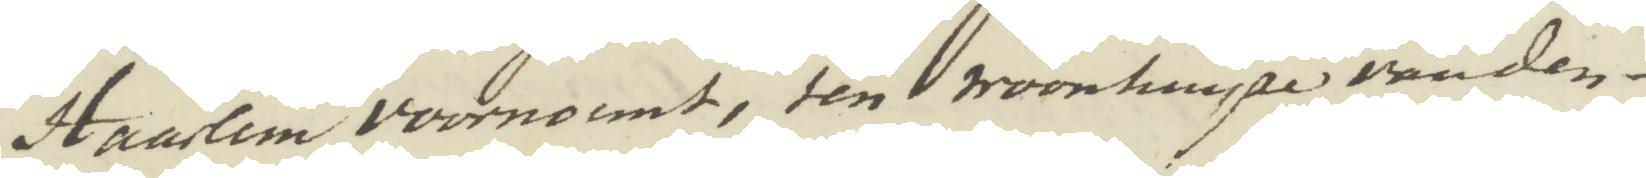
Haarlem voornoemt, ten woonhuyse van den -
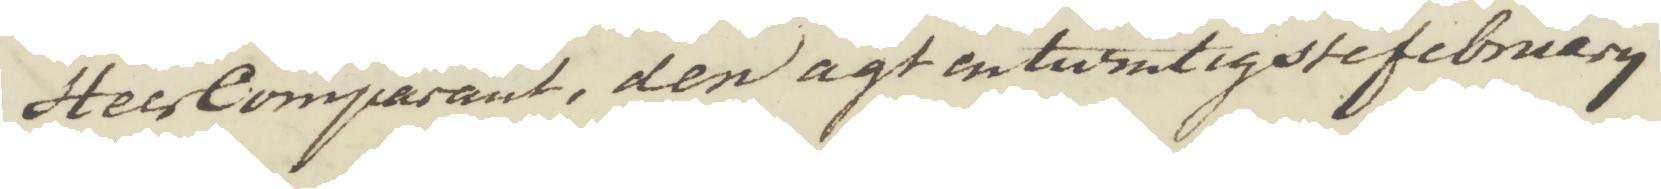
Heer Comparant, den agt en twintigste february
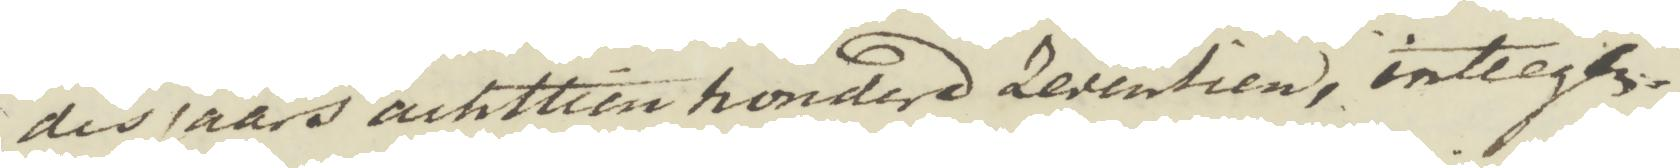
des jaars achttien honderd Zeventien, integen„
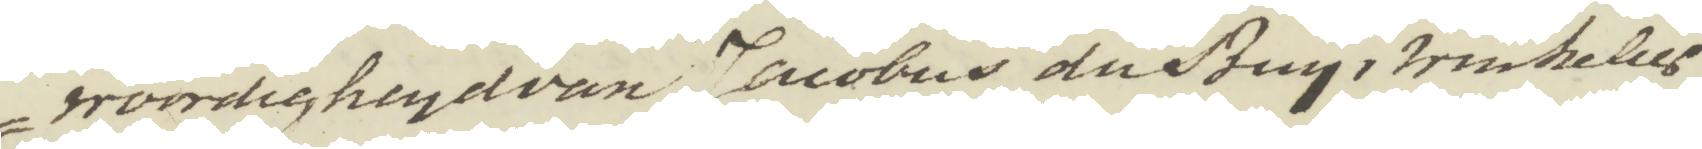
=woordigheyd van Jacobus du Buy, winkelier
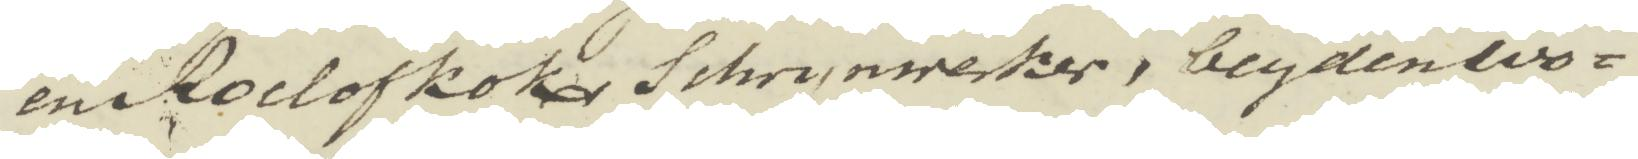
en Roelof Kok, schrynweker, beyden wo=
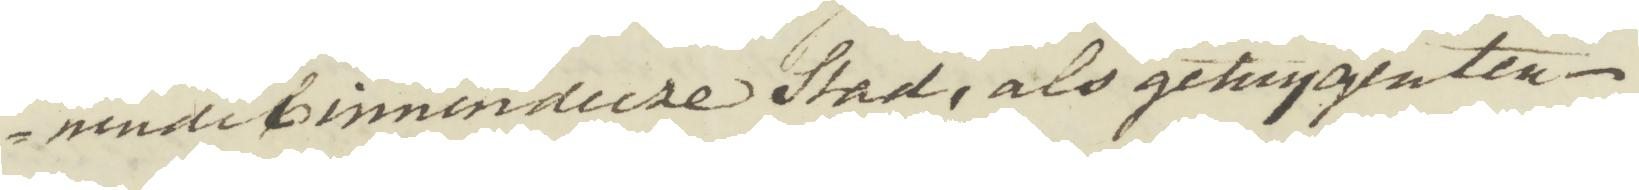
=nende binnen deeze Stad, als getuygen ten-
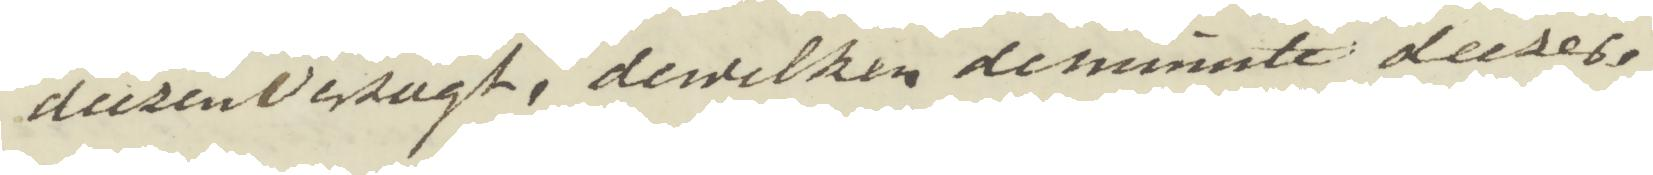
deezen verzogt, dewelken de minute deezes,
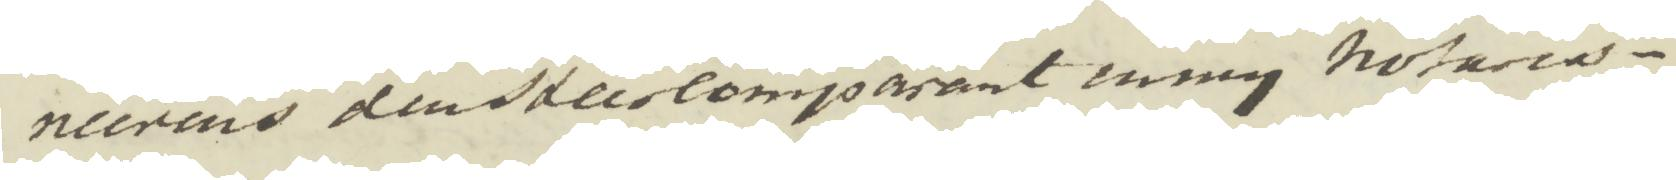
neevens den Heer Comparant en my Notaris -
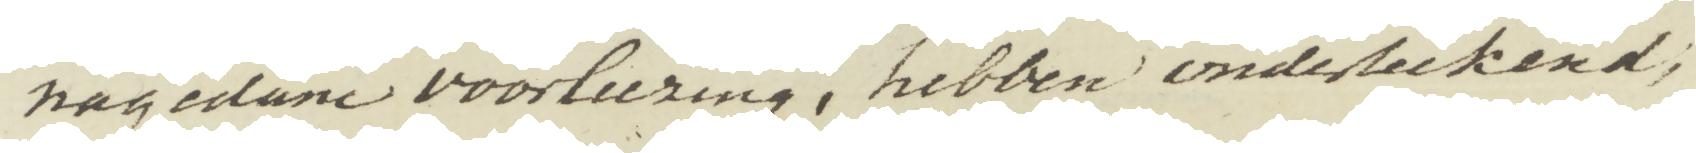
nagedane voorleezing, hebben onderteekend,
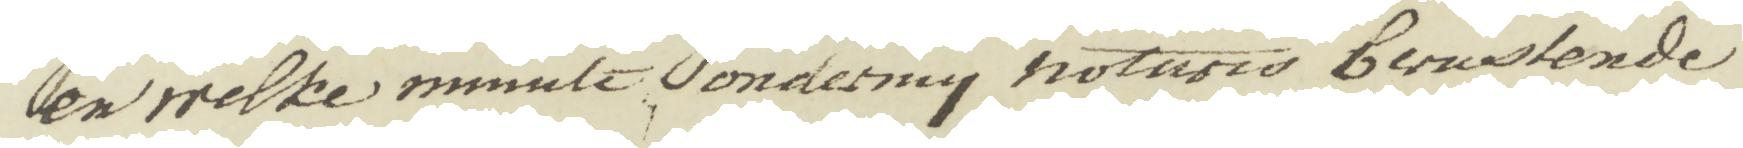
en welke minute ondermy notaris berustende
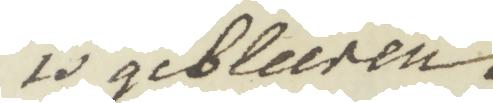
is gebleeven.
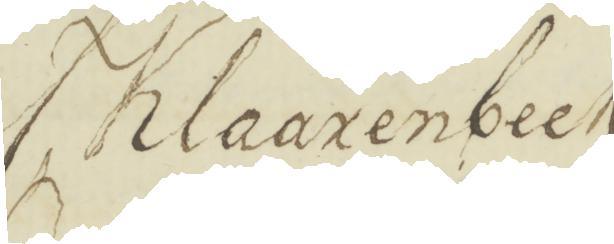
C. Klaarenbeek
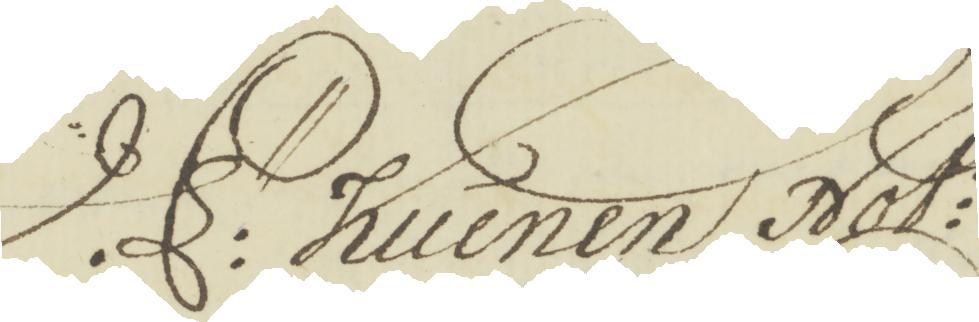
J: P: Kuenen. Not:
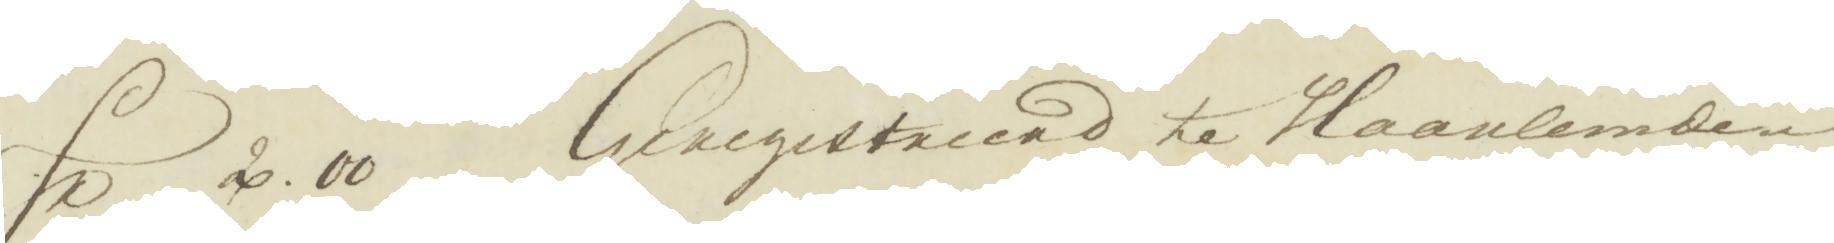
Fr 2. 00 Geregistreerd te Haarlem den
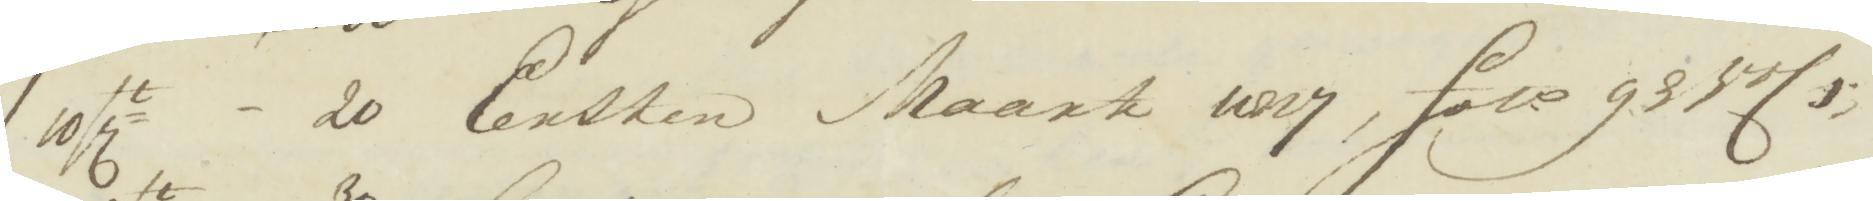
10 pr=t - 20 Eersten Maart 1817, fol.o 98 No. C1,
